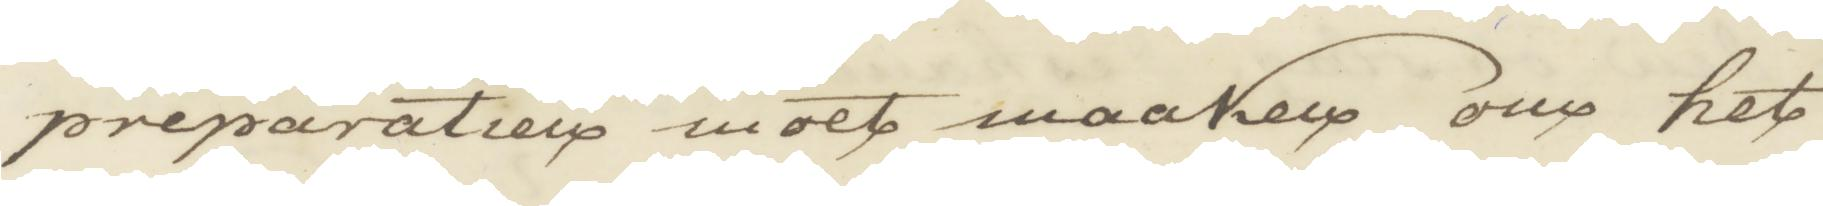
preparatien moet maaken om het
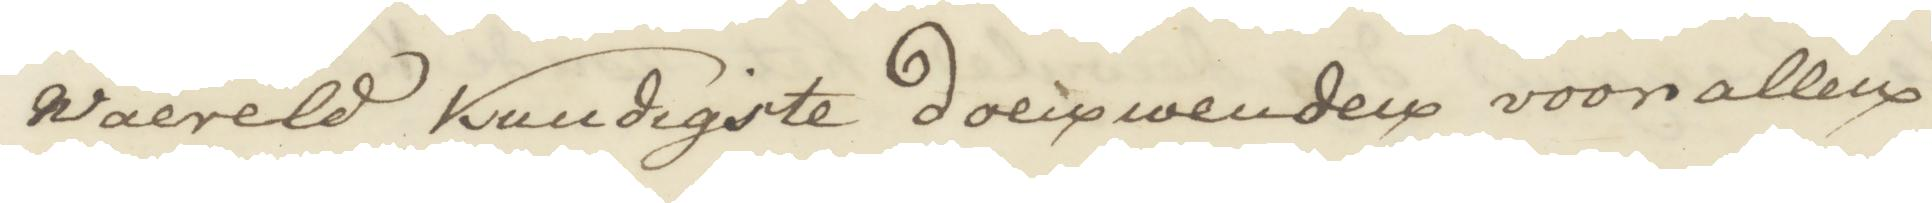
waereld kundigste doen wenden voor allen
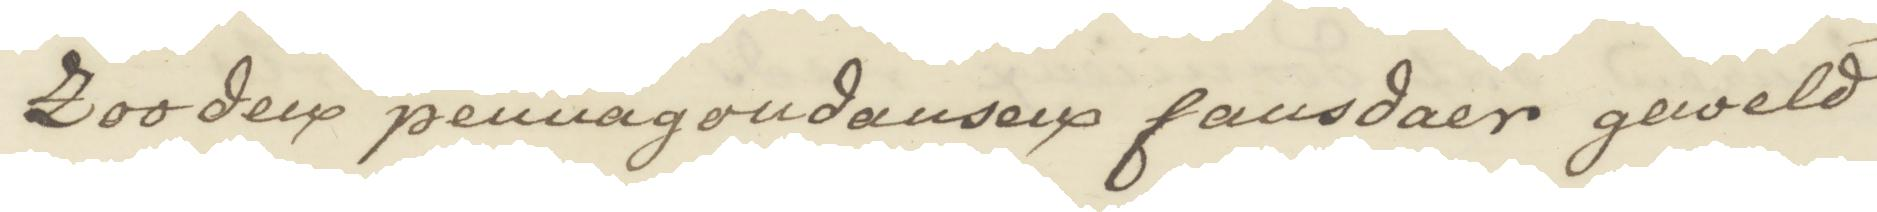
zoo den pennagoudansen fausdaer geweld
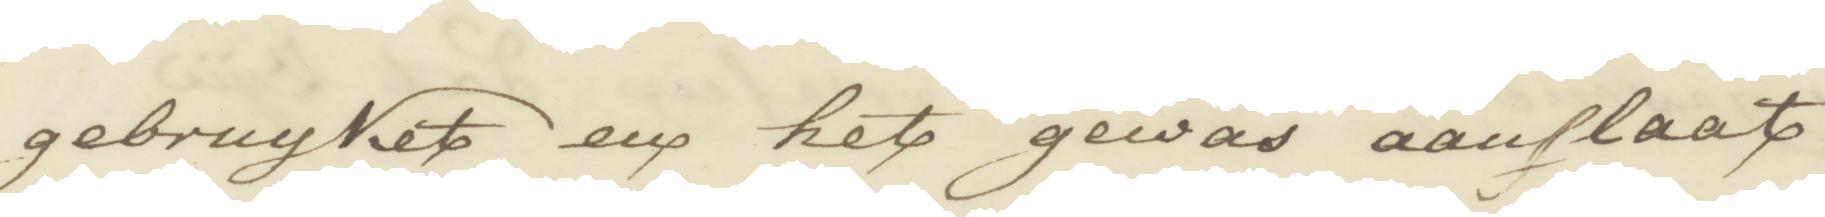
gebruijket en het gewas aanslaat
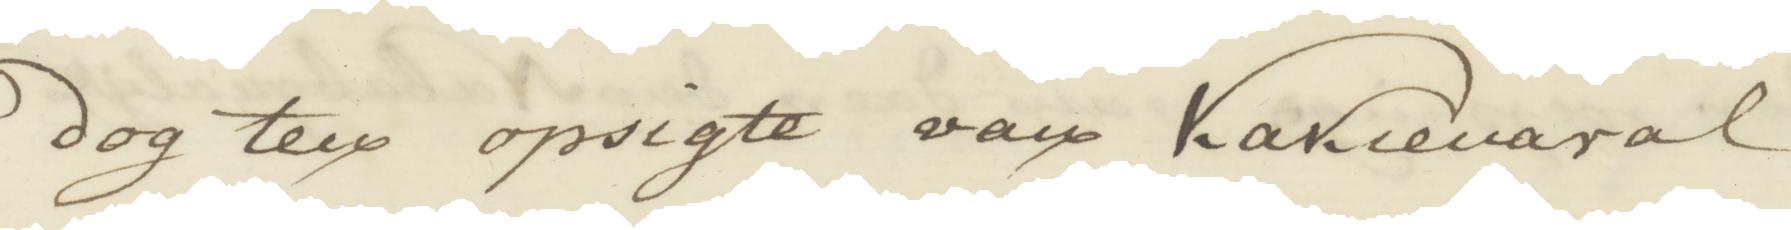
dog ten opsigte van kakienaral
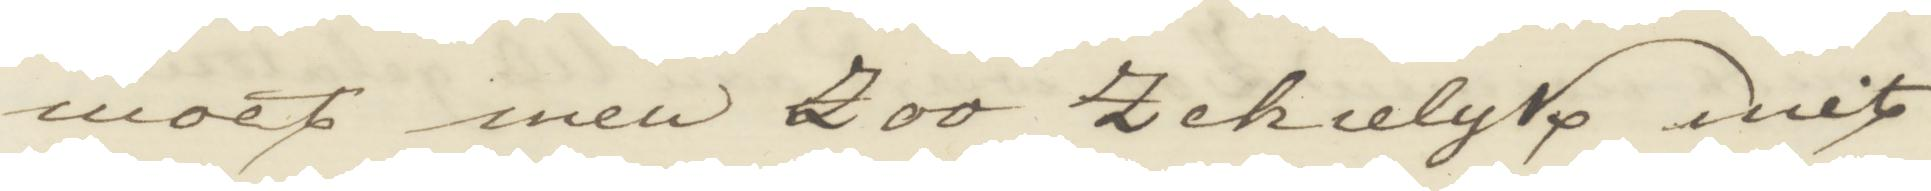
moet men zoo zchielyk niet
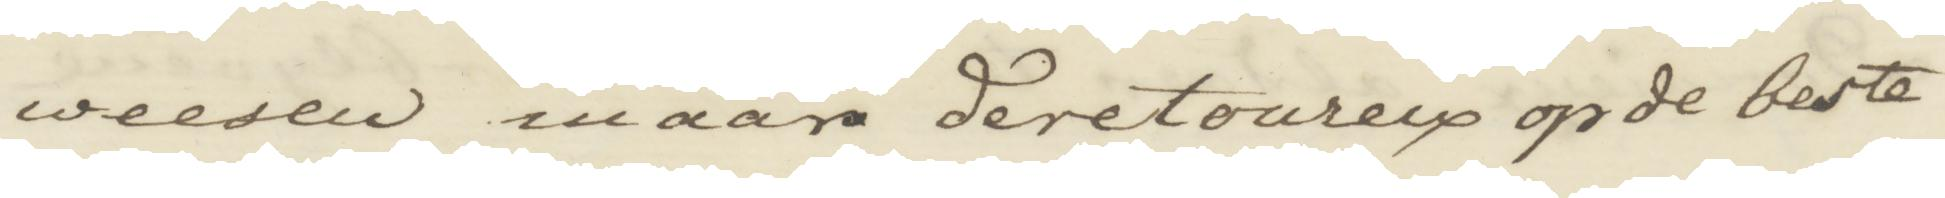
weesen maar deretouren op de beste
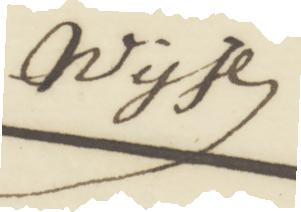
wijse
